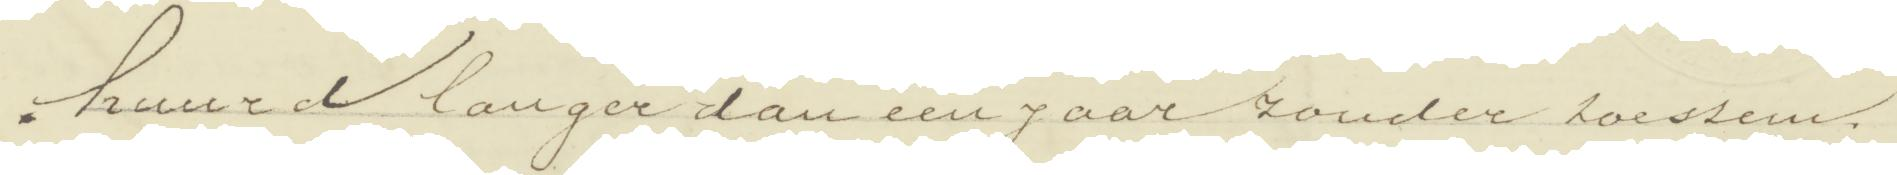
=huurd langer dan een jaar zonder toestem.
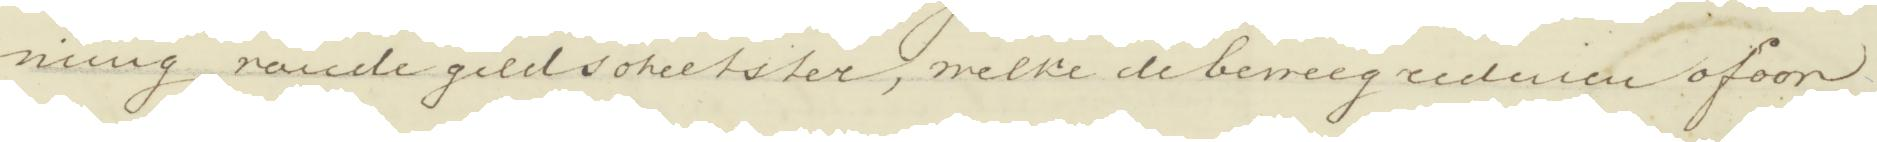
ming vande geldschietster, welke de beweegredenen of oor
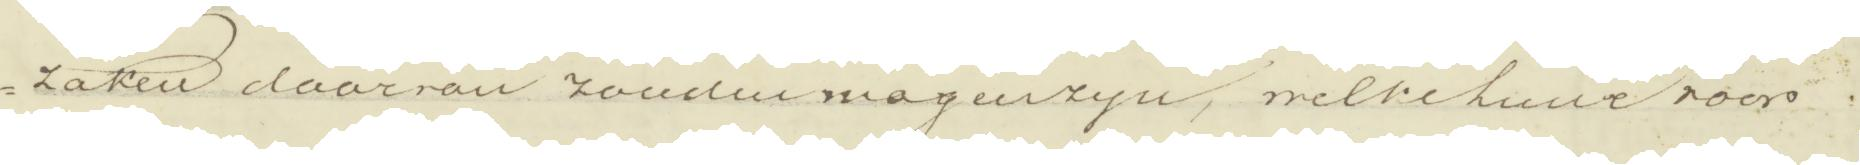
=zaken daarvan zouden mogen zyn, welke huur voor
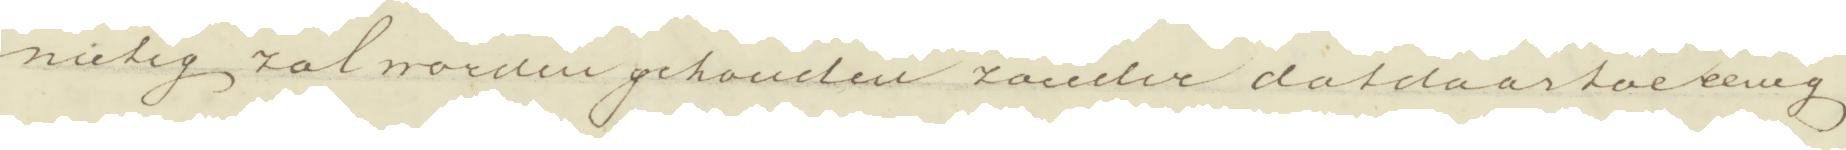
nietig zal worden gehouden zonder dat daartoe eenig
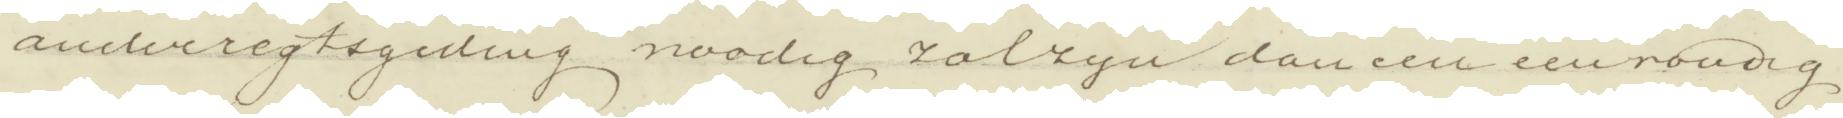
ander regtsgeding noodig zal zyn dan een eenvoudig
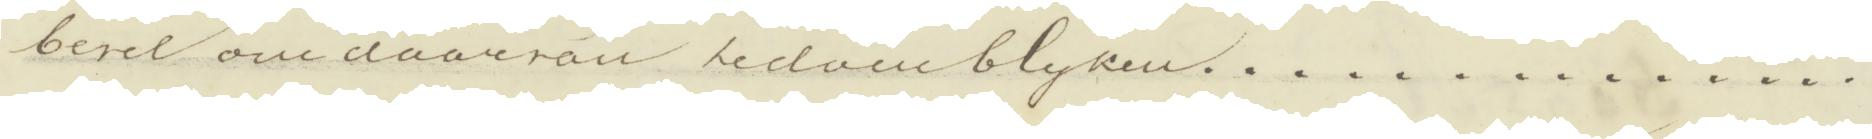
bevel om daarvan tedoen blyken. . . . . . . . . . . . . .
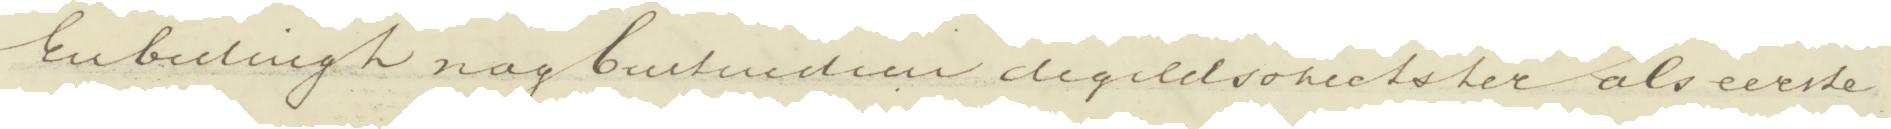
En bedingt nog buitendien de geldschietster als eerste
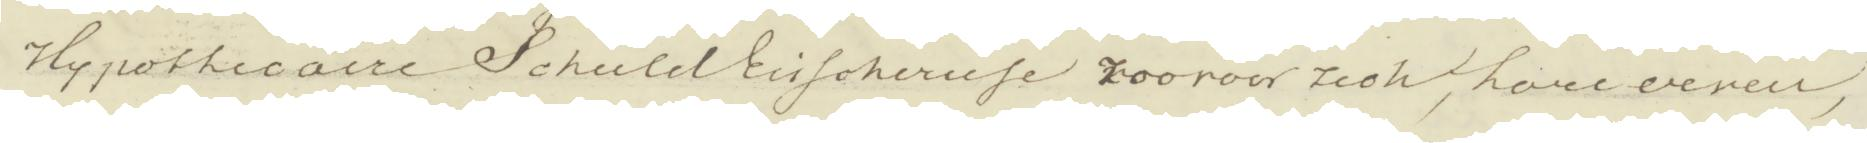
Hypothecaire Schuld Eisscheresse zoo voor zich, hare erven,
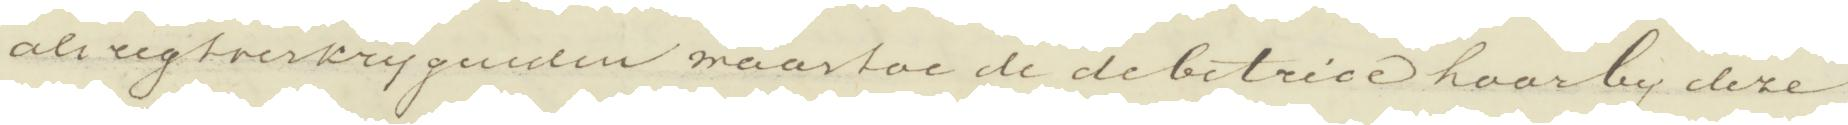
als regtverkrygenden waartoe de debetrice haar by deze
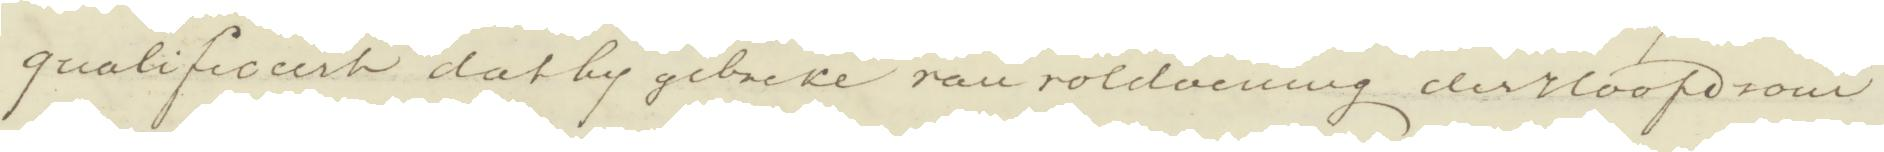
qualificeert dat by gebreke van voldoening der Hoofdsom
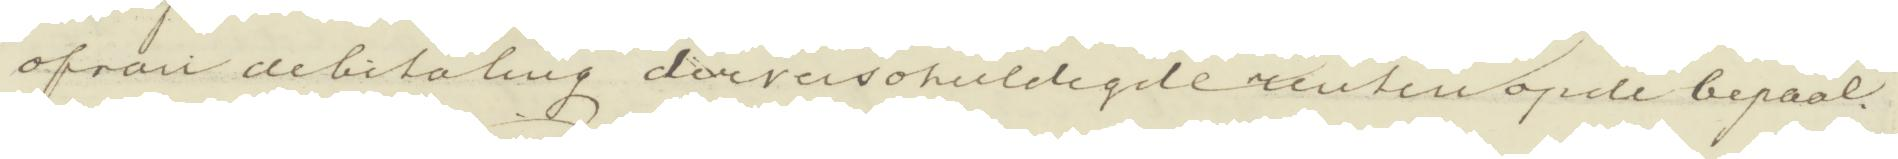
of van de betaling der verschuldigde renten op de bepaal.
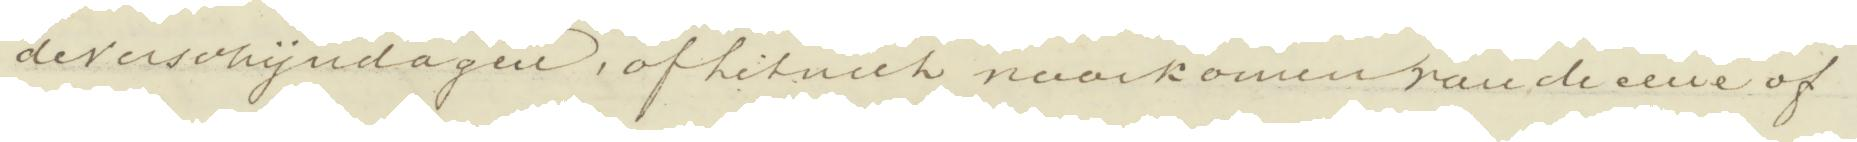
de verschijndagen, of het niet naarkomen van de eene of
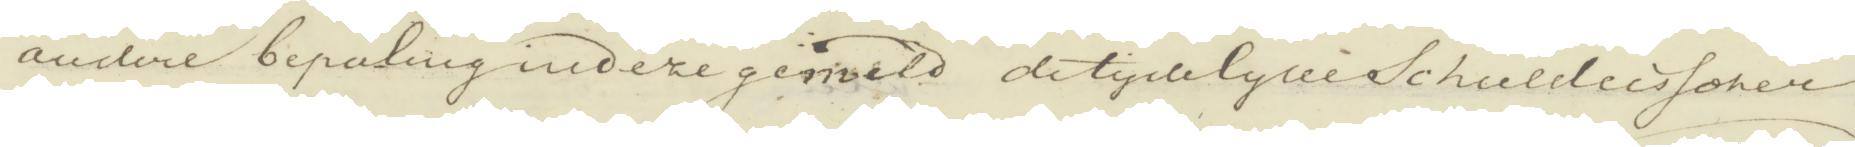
andere bepaling in deze gemeld de tijdelyke Schuldeisscher
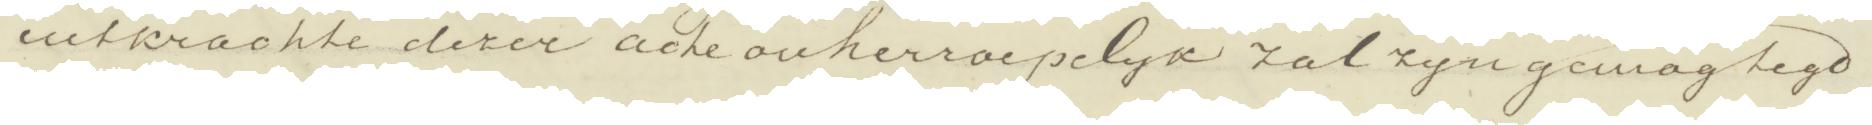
uit krachte dezer acte onherroepelyk zal zyn gemagtigd
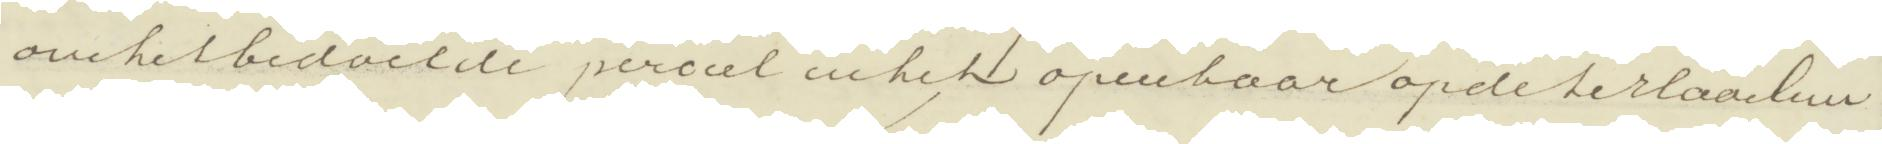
om het bedoelde perceel in het openbaar op de te Haarlem
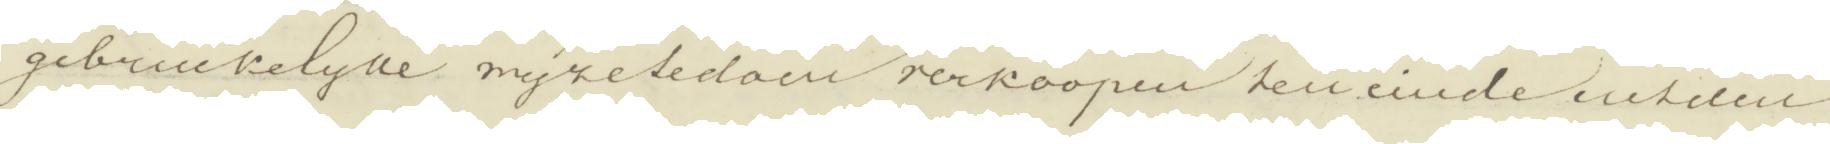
gebruikelyke wyze tedoen verkoopen ten einde uit den
